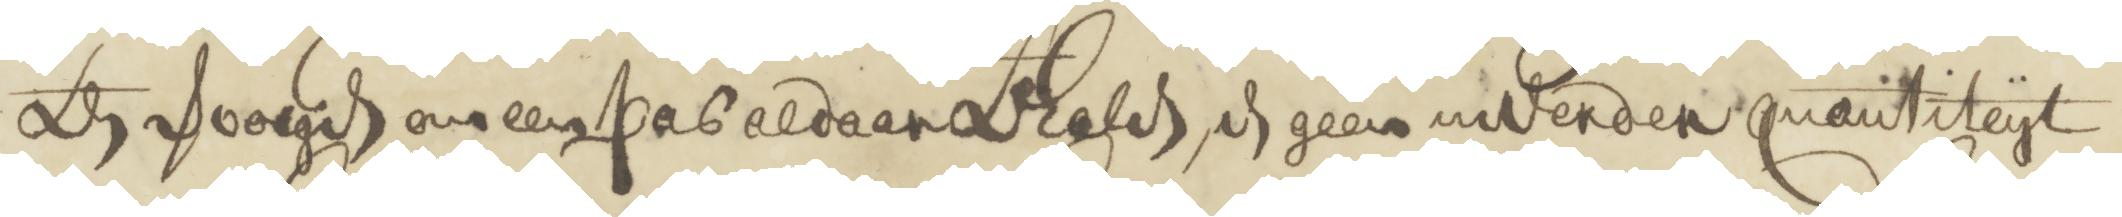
ten vervoegen om een pas aldaar te halen, en geen meerder quantiteijt
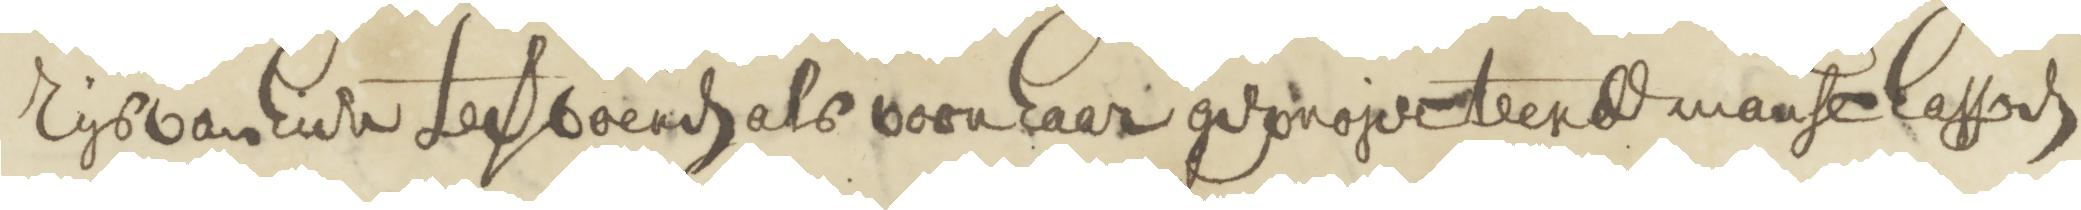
Rijs van hier te vervoeren als voor haar geprojecteerde manschappen
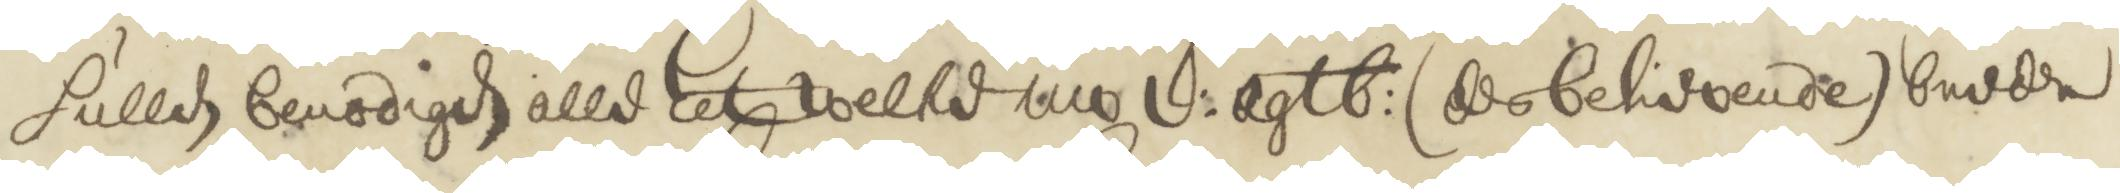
Sullen benodigen alle het welke uw E: agtb: (des believende) breder
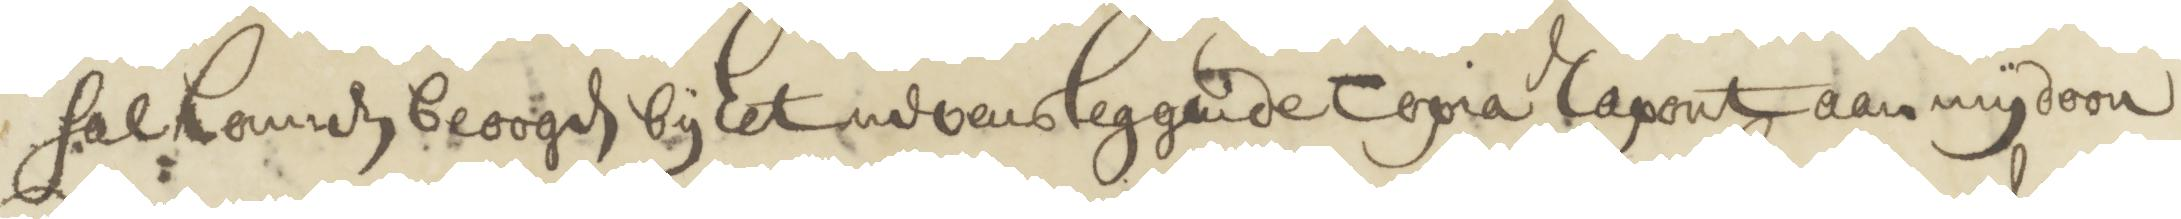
Sal konnen beoogen bij het nevensleggende Copia Raport aan mij door
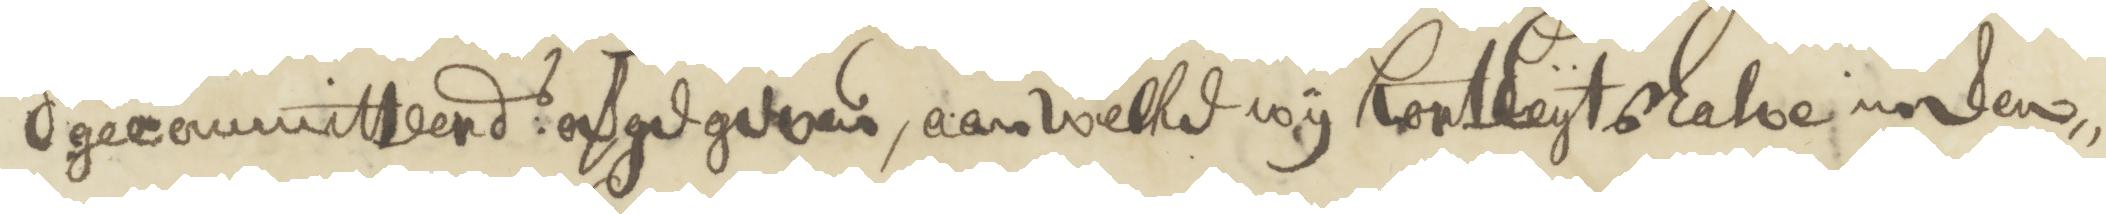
d'gecommitteerd:s overgegeven, aan welke wij kortheijtshalve in Eer„
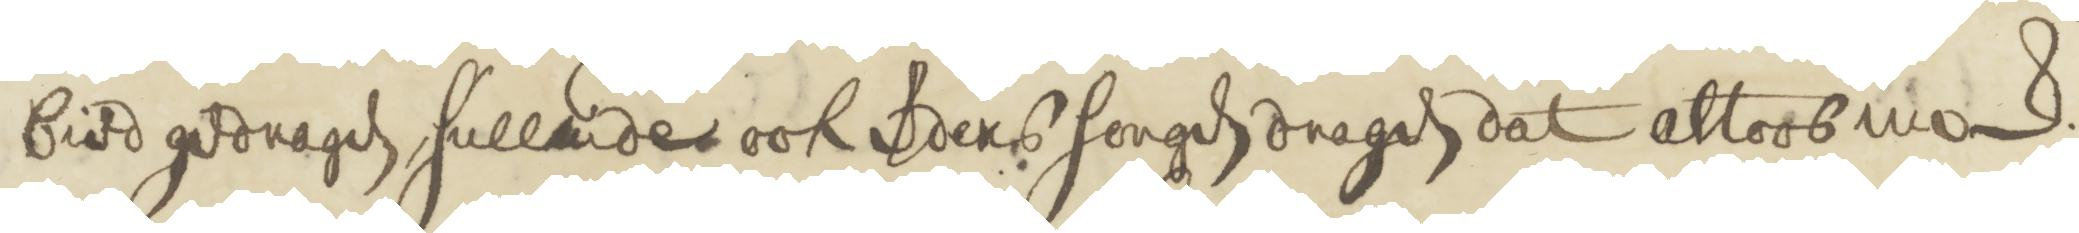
bied gedragen, sullende ook verders Sorgen dragen dat altoos uw E:
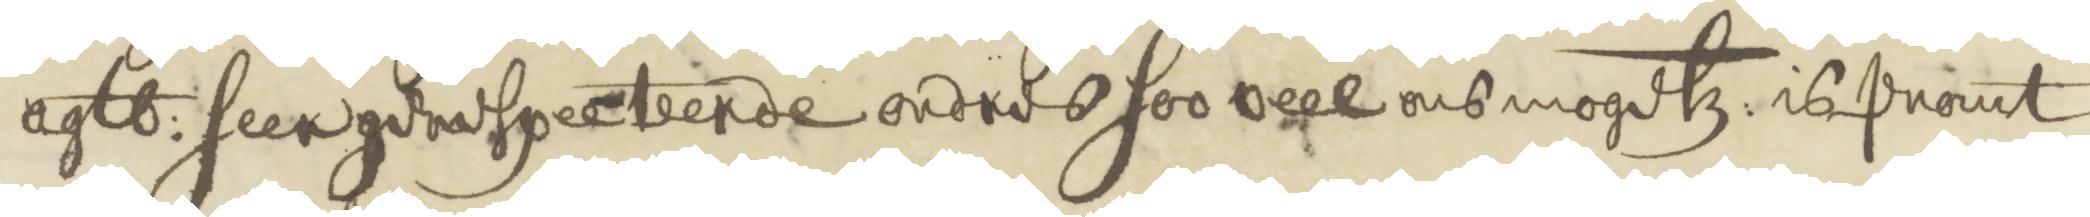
agtb: Seer gerespecteerde ordres Soo veel ons mogelijk is promt
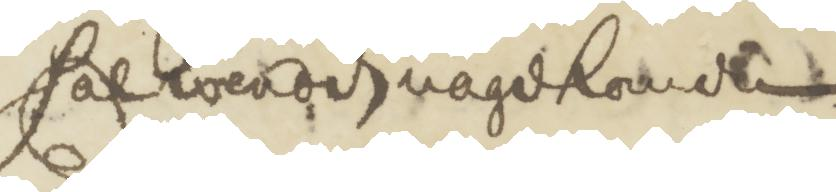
Sal werden nagekomen
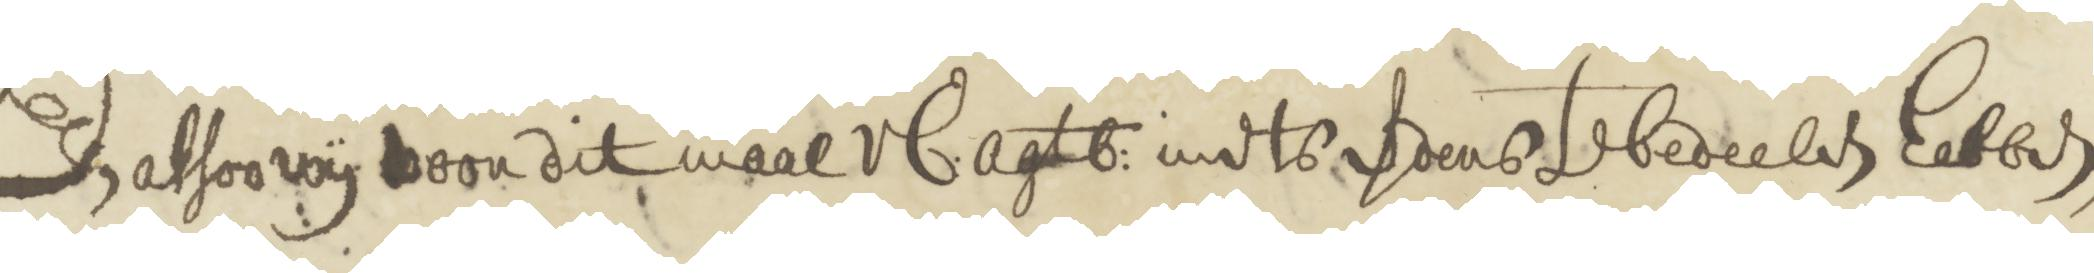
En alsoo wij door dit maal VE: agtb: niets verders te bedeelen hebben
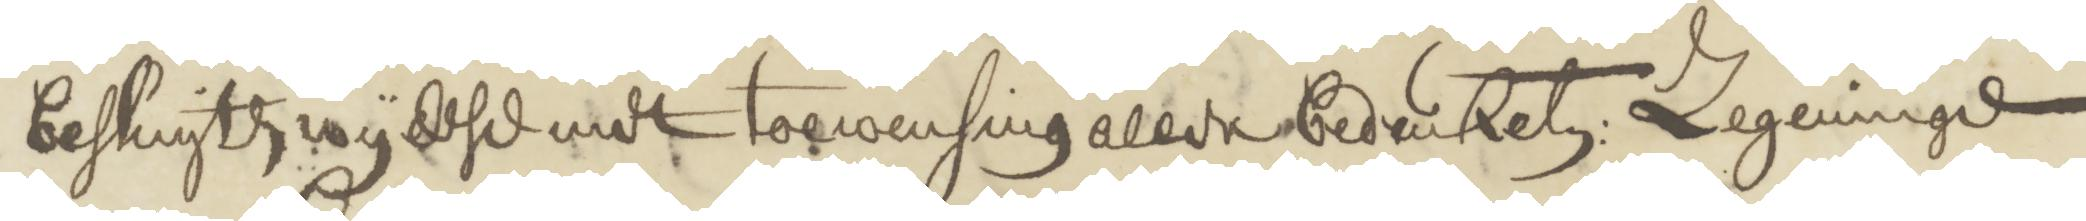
besluijten wij dese met toewensing aller bedenkelijke Zegeninge
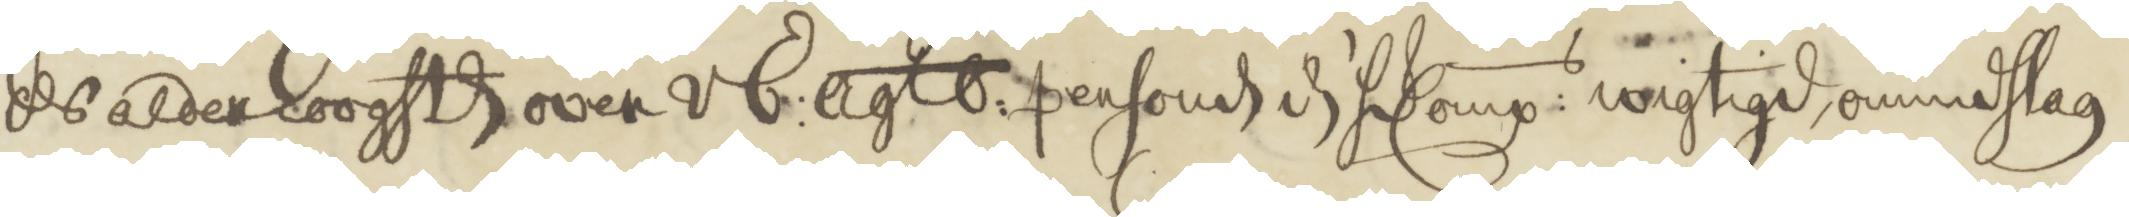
des alder hoogsten over vE: agtb: personen en 'S EComp:s wigtige, ommeslag
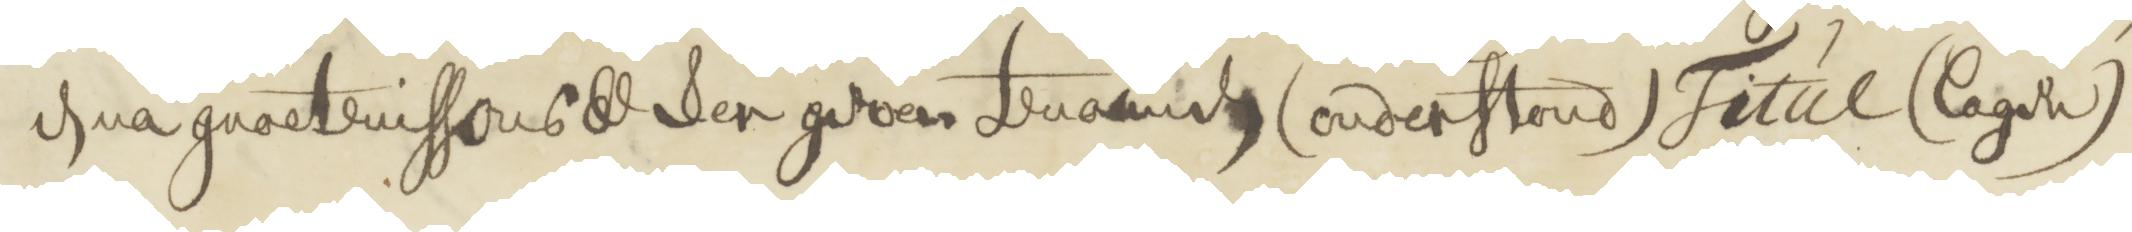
en na groeteniss ons de Eer geven te noemen (onder stond) Titul (lager)
